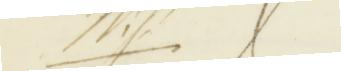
W:S: C
